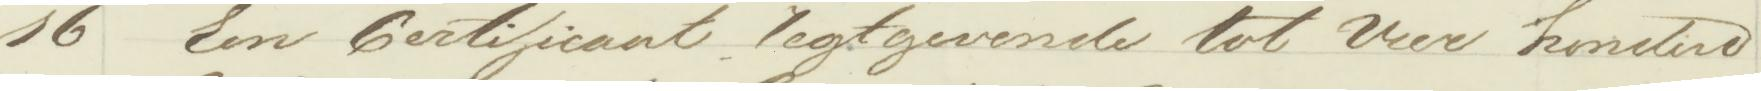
16 Een Certificaat regtgevende tot vier honderd
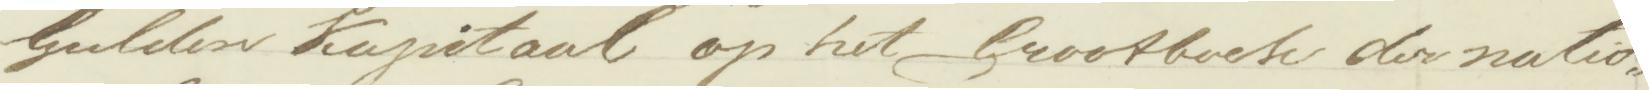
Gulden kapitaal op het Grootboek der natio„
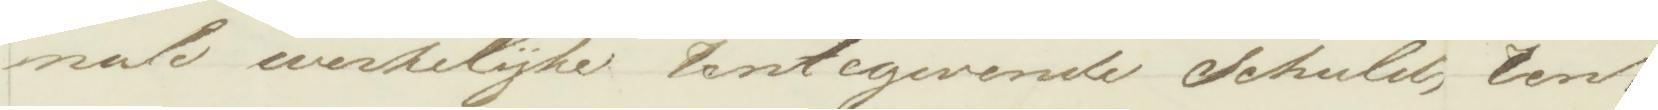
,nale werkelijke rentegevende Schuld, ren„
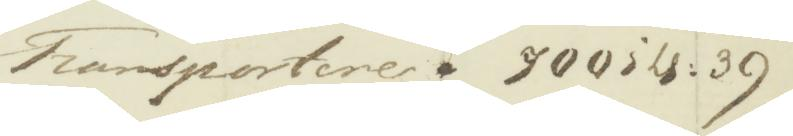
Transportere ƒ 70054:39
